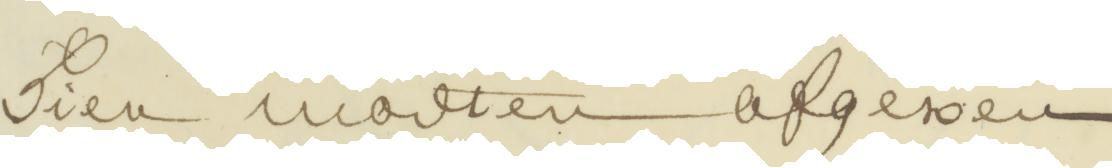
hier moeten afgeven
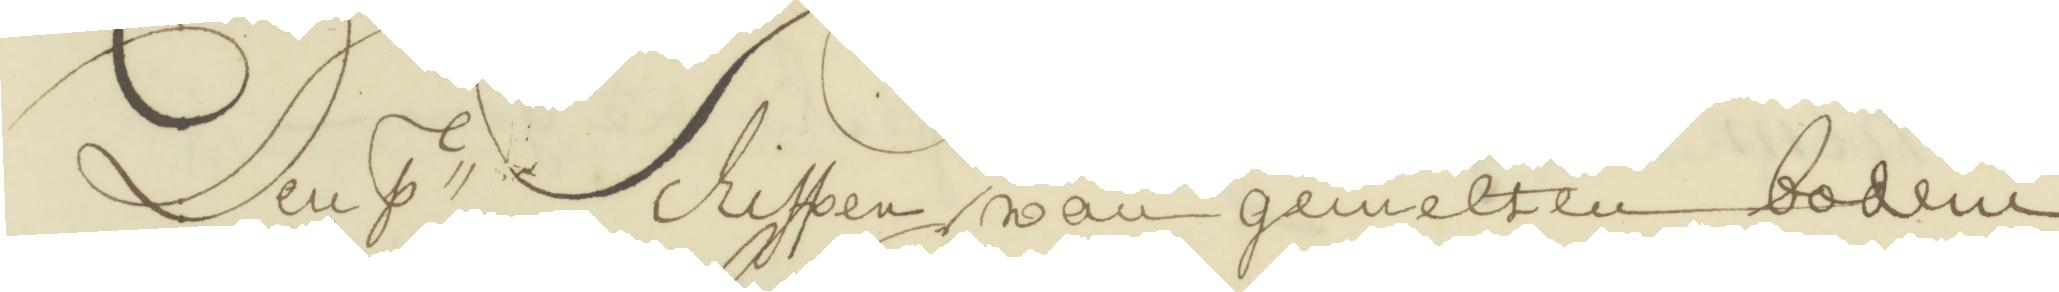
Den p„l Schipper, van gemelten bodem
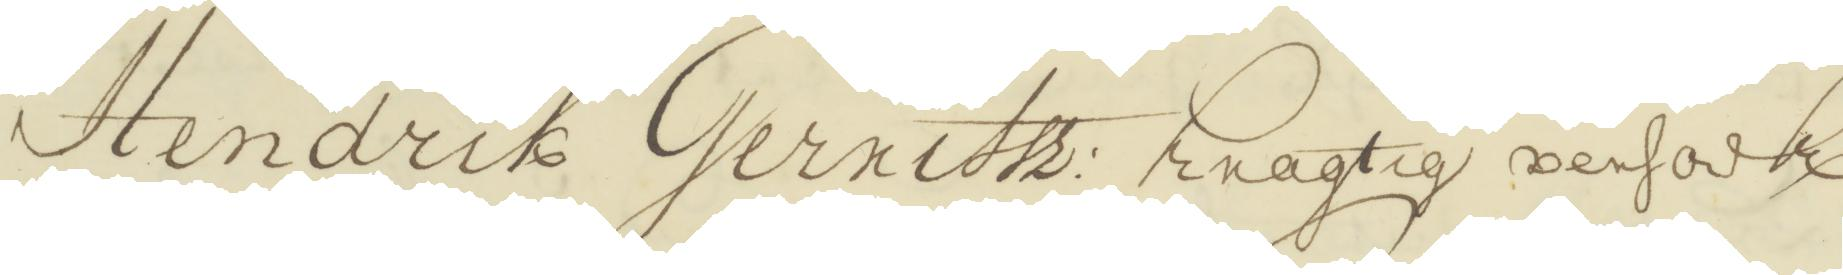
Hendrik Gerritsz: kragtig versoek
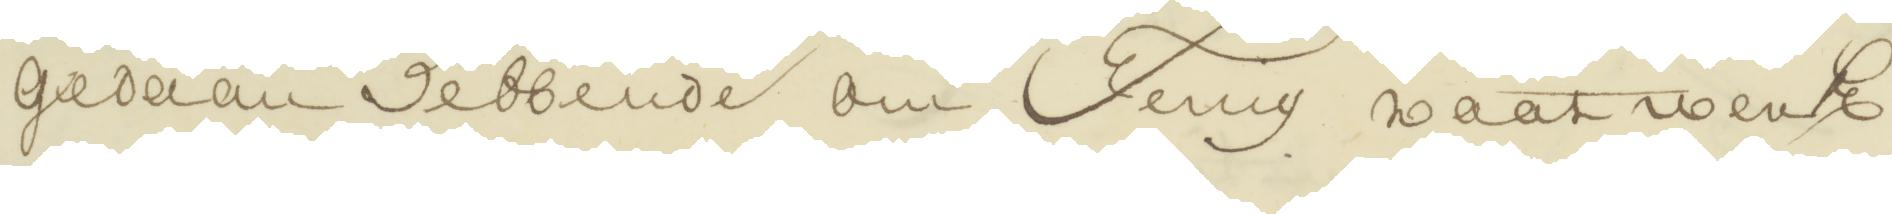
gedaan hebbende om Eenig vaatwerk
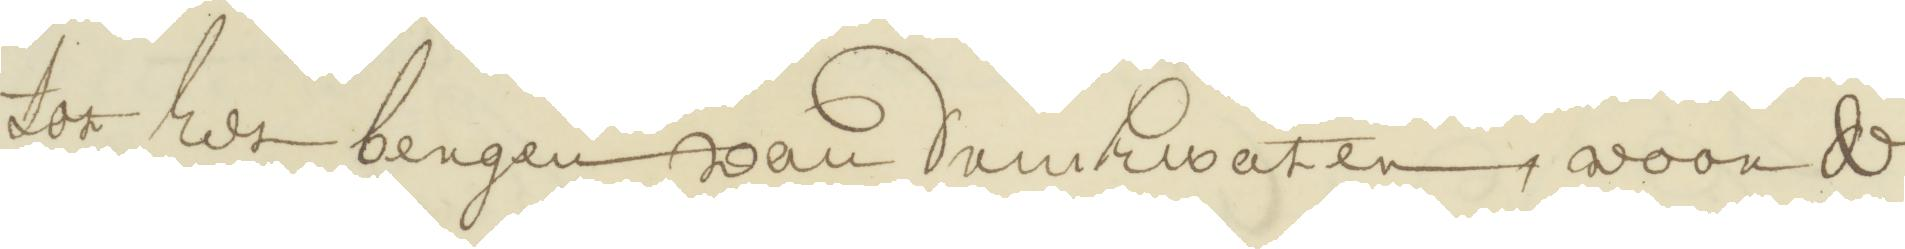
tot het bergen van drinkwater, voor de
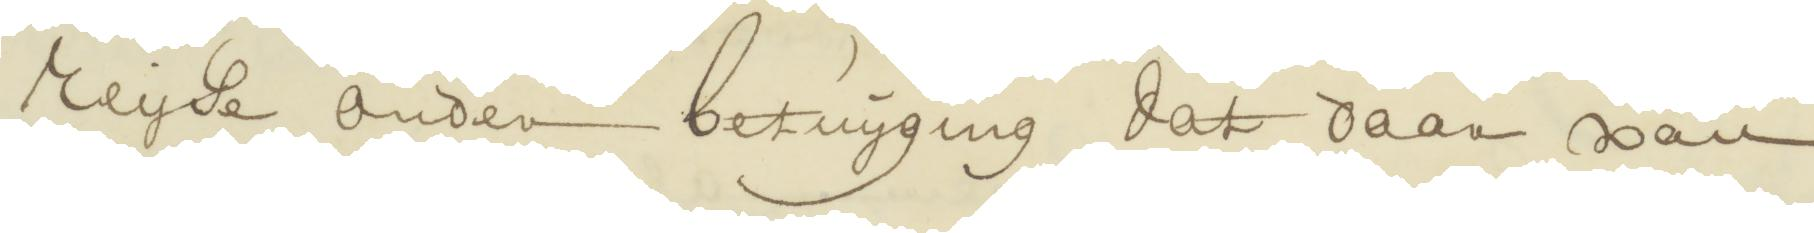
reijse onder betuijging dat daar van
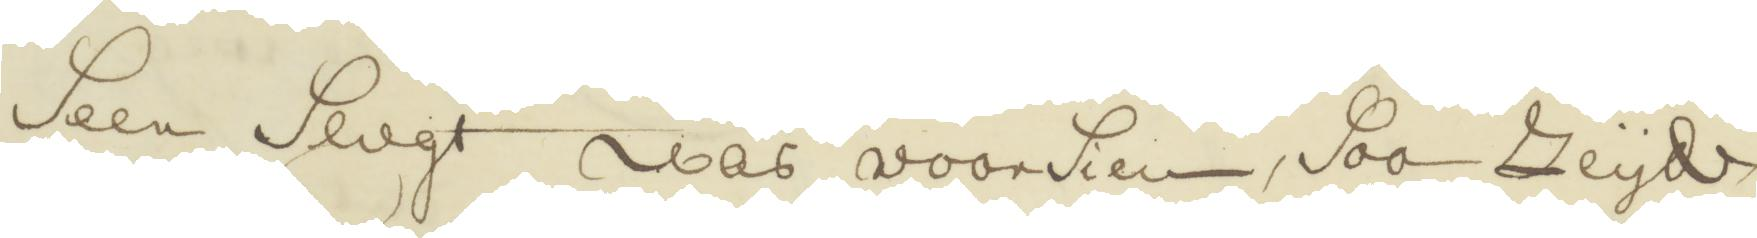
seer slegt was voorsien, soo zeijde
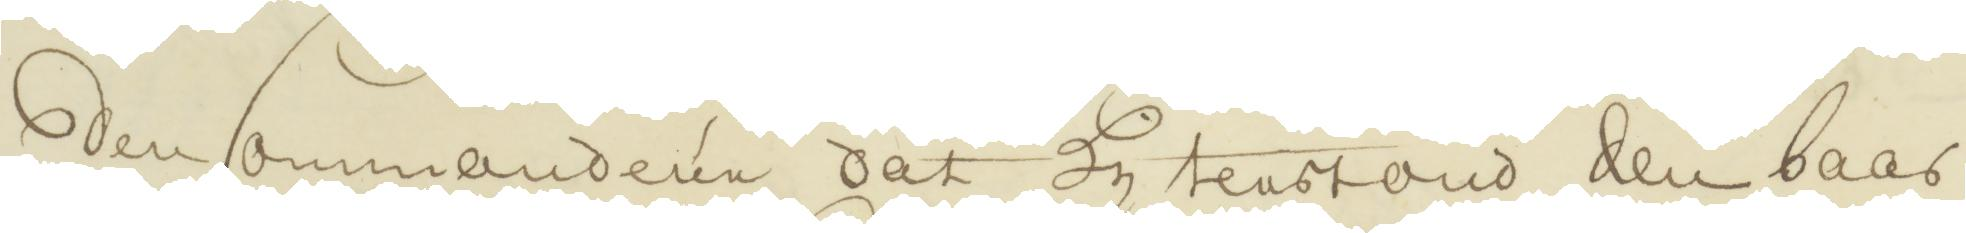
den Commandeur dat hij terstond den baas
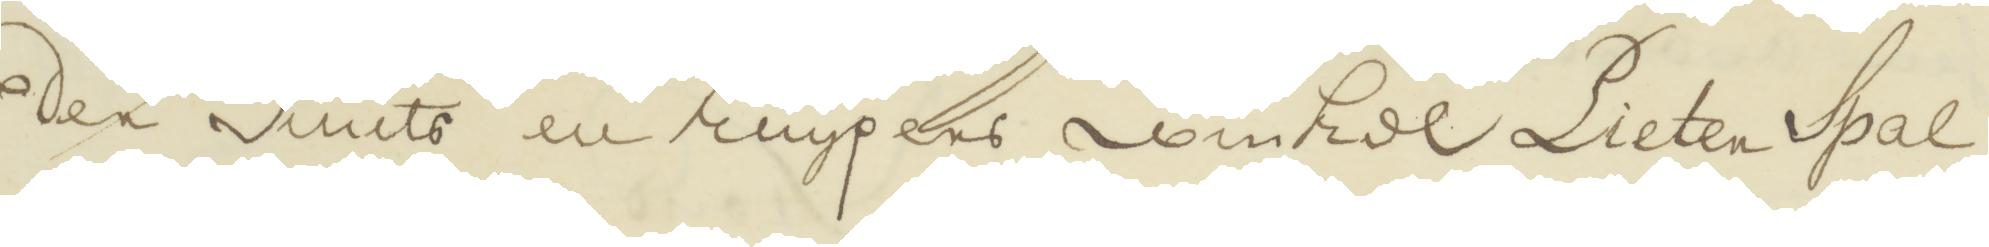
der smits en kuijpers winkel Pieter spal
